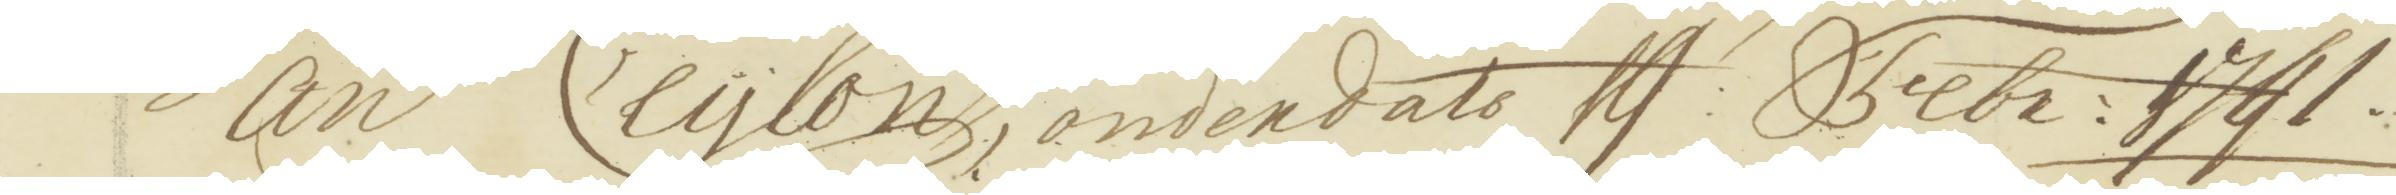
Van Ceijlon, onder dato 19:' Febr: 1741:
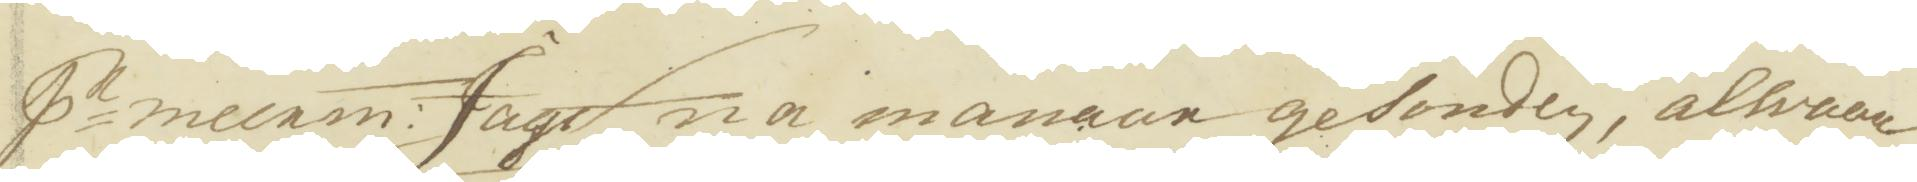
p=r meerm: Jagt na manaar gesonden, alwaar
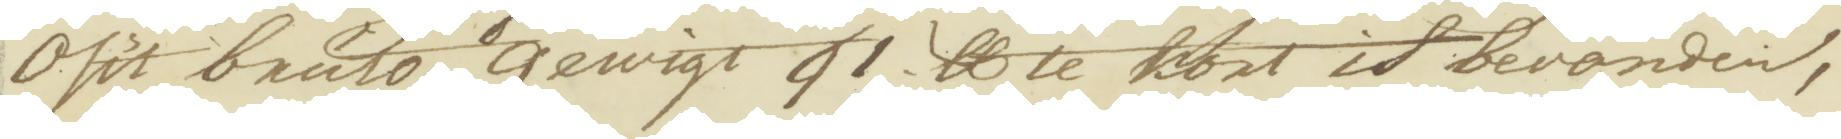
Op't bruto gewigt 41. lb te kort is bevonden,
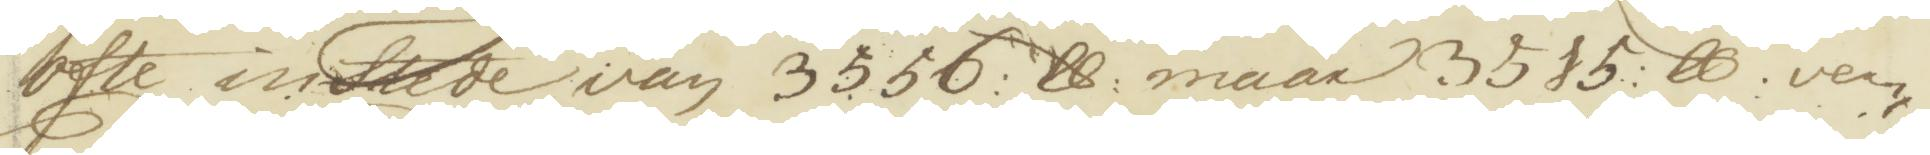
ofte instede van 3556: lb: maar 3515: lb. ver
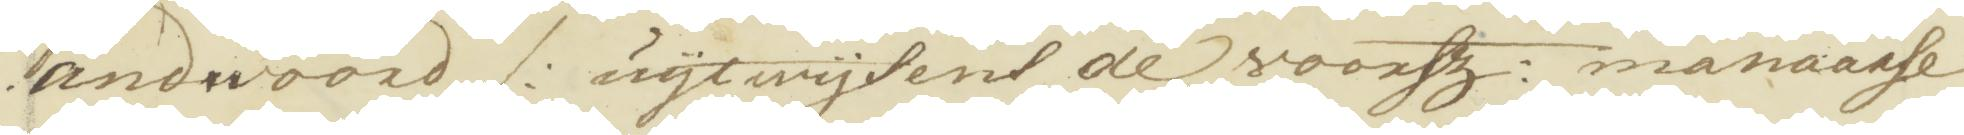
andwoord /: uijtwijsens de voorsz: manaarse
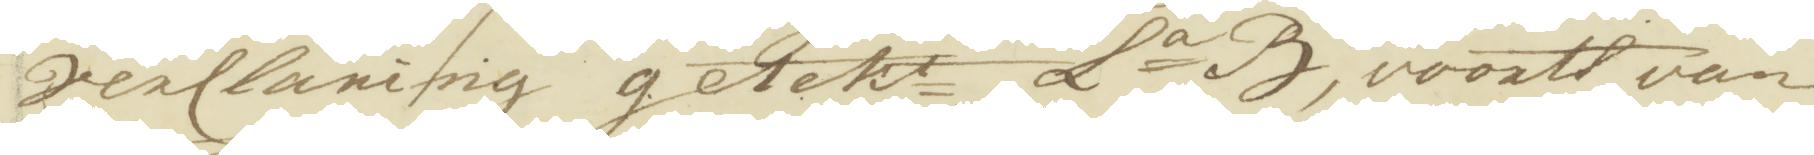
verclaring getek=t L=a B, voorts van
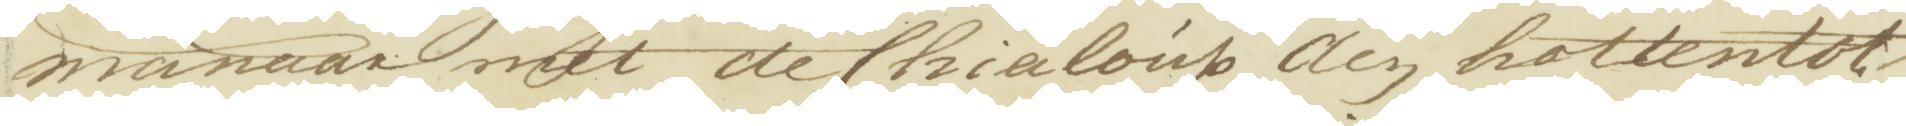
manaar met de Chialoup den hottentot
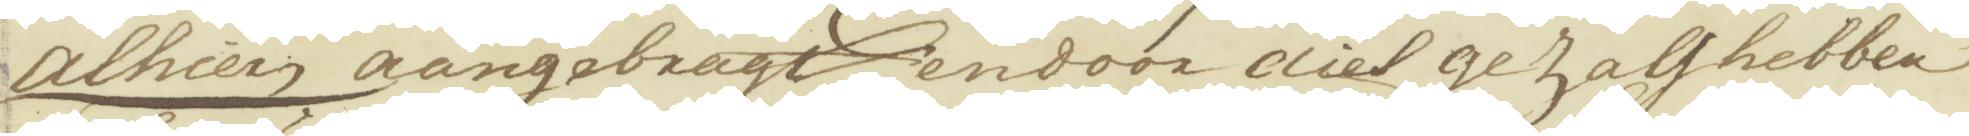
alhier aangebragt en door dies gezag hebber
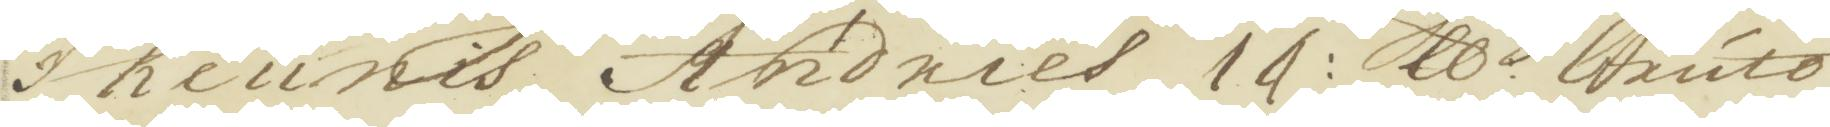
Theunis Andries 14: lb: bruto
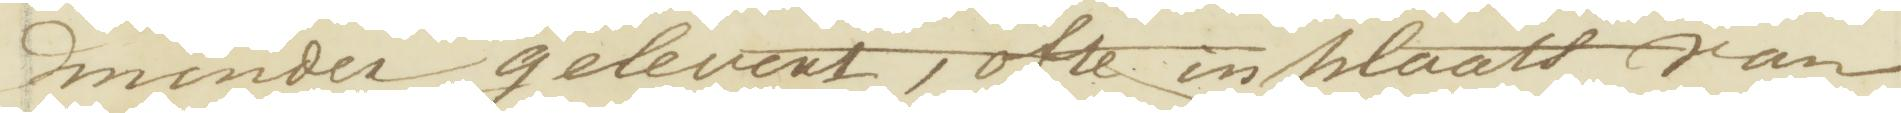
minder gelevert, ofte in plaats van
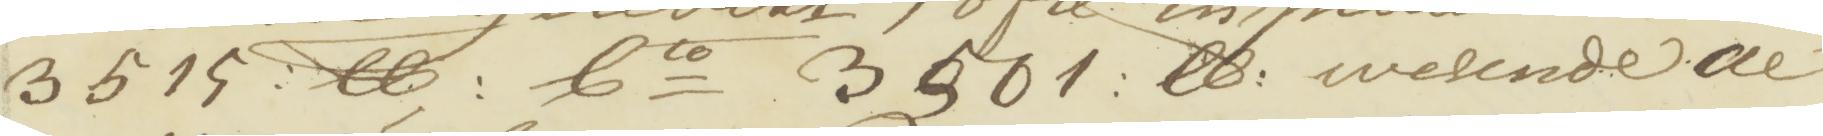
3515: lb: C=to 3501: lb: wesende de
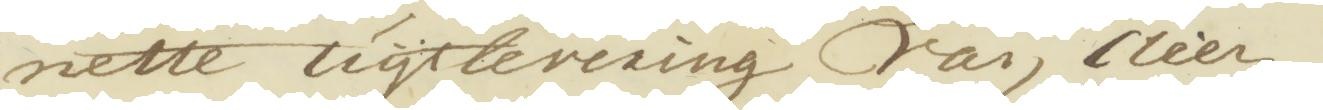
nette uijtlevering van dien.
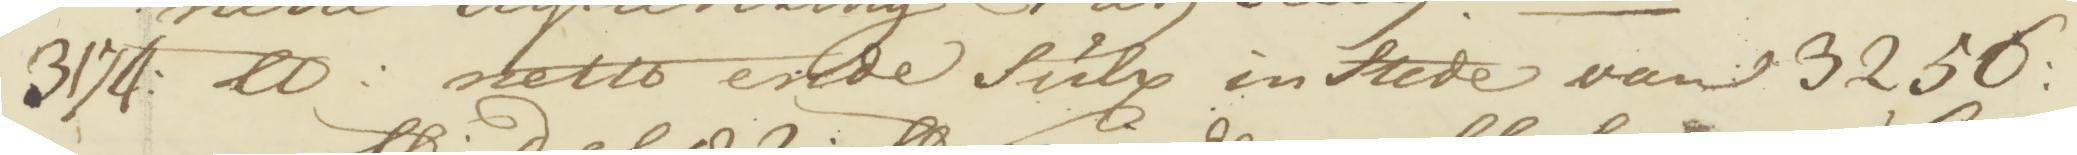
3174: lb: netto ende sulx in stede van 3256:
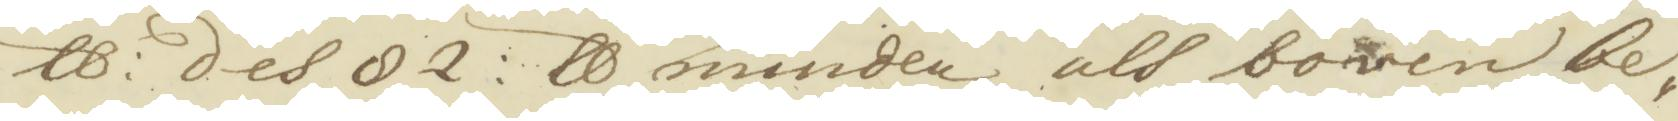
lb: des 82: lb minder als boven be„
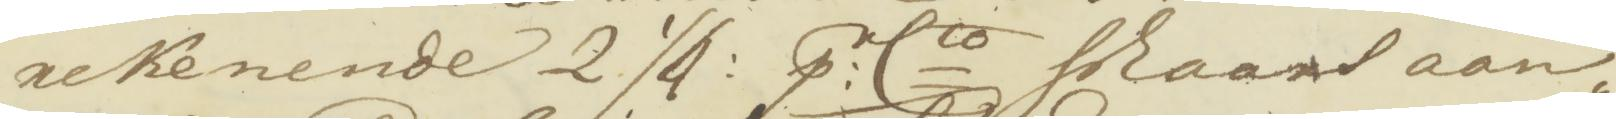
rekenende 2¼: p:r C=to schaars aan
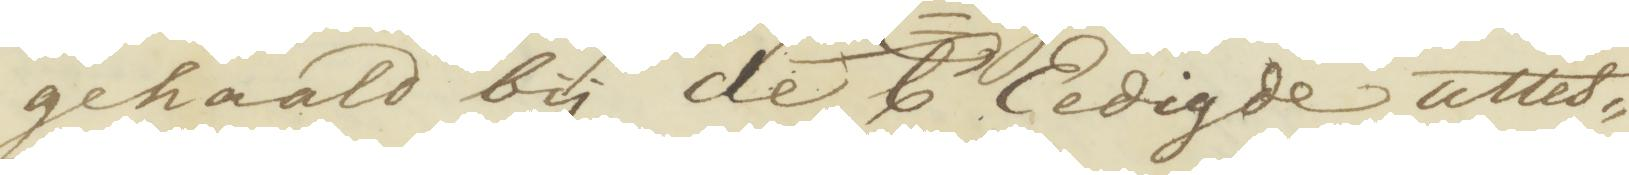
gehaald bij de b' Eedigde attes„
